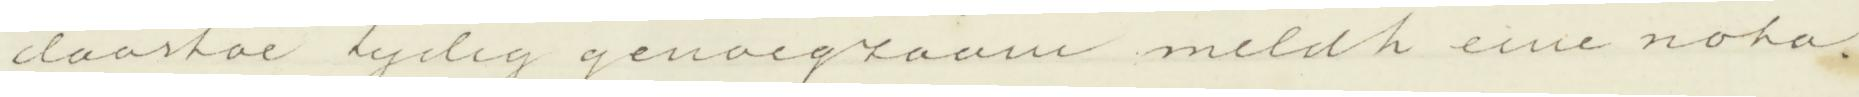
daartoe tydig genoegzaam meldt eene nota„
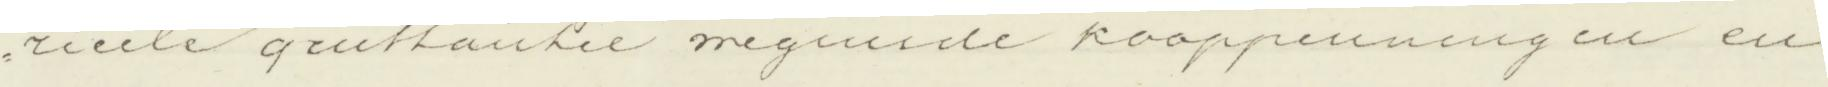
„rieele quittantie wegensde kooppenningen en
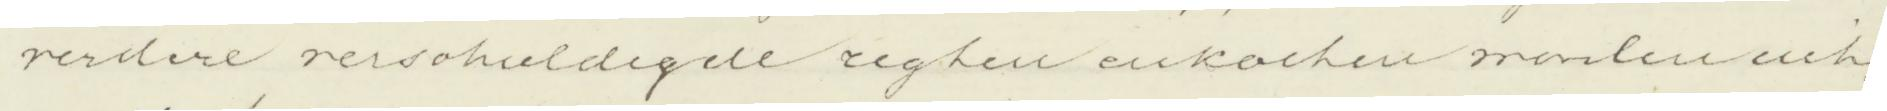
verdere verschuldigde regten enkosten worden uit
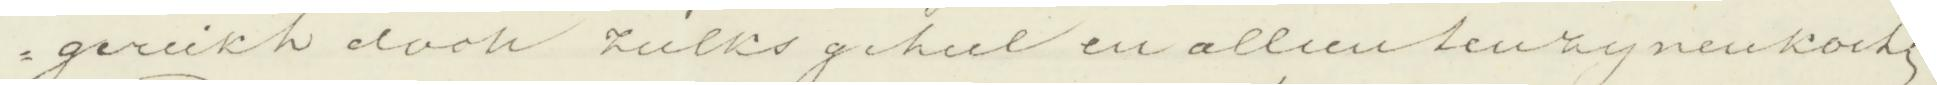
=gereikt doch zulks geheel en alleentenzynenkosten
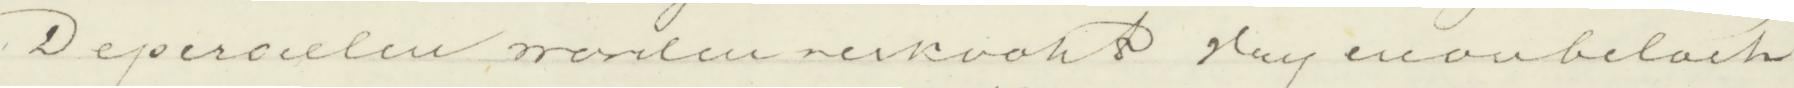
De perceelen worden verkocht vry enonbelast
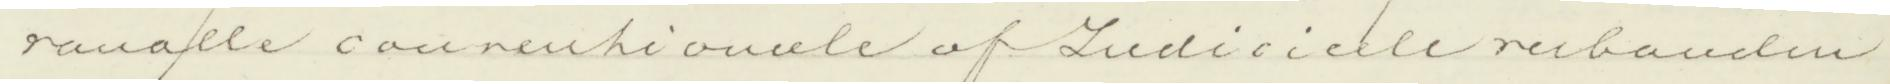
vanalle conventioneele ofIudicieele verbanden
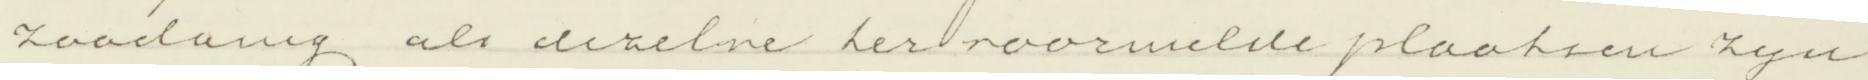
zoodanig als dezelve ter voormelde plaatsen zyn
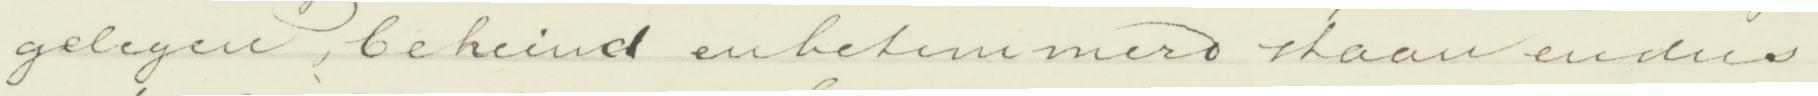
gelegen, beheind enbetimmerd staan endus
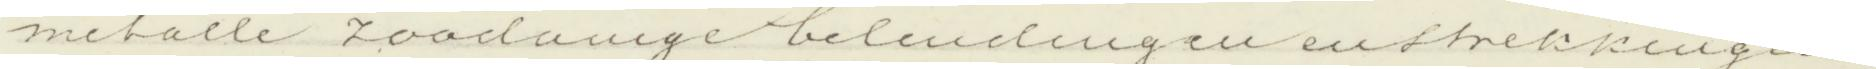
metalle zoodanige belendingen enstrekkingen
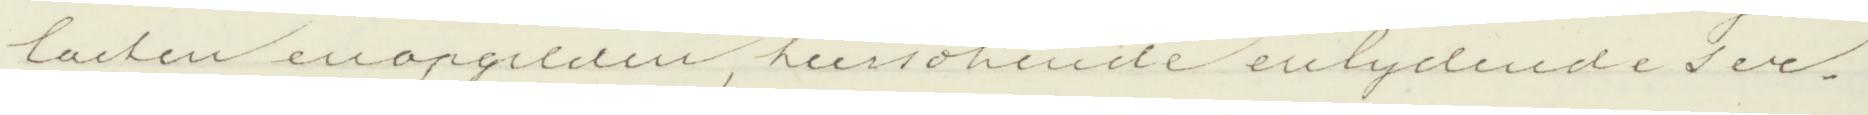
lasten en opgelden, heerschende enlydende ser„
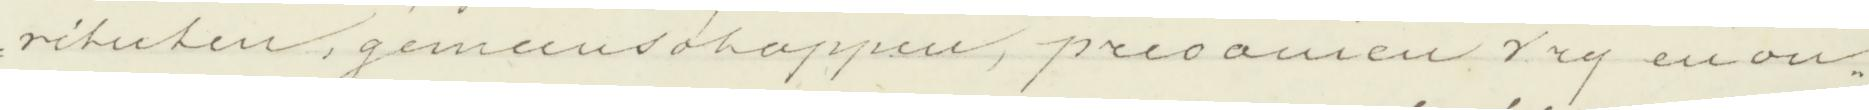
„rituten, gemeenschappen, preo anien vry en on„
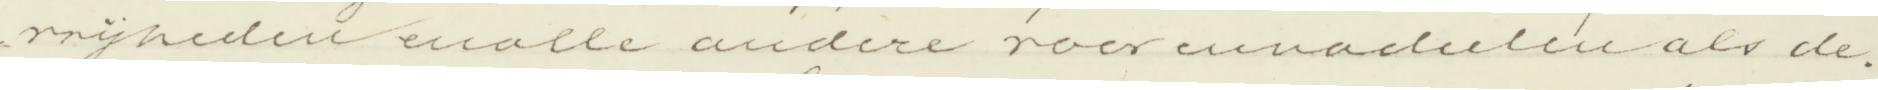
„vrijheden enalle andere voor ennadeelen als de„
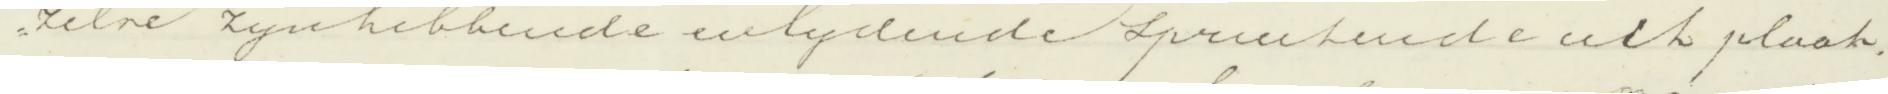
„zelve zynhebbende enlydende spruitende ult plaat„
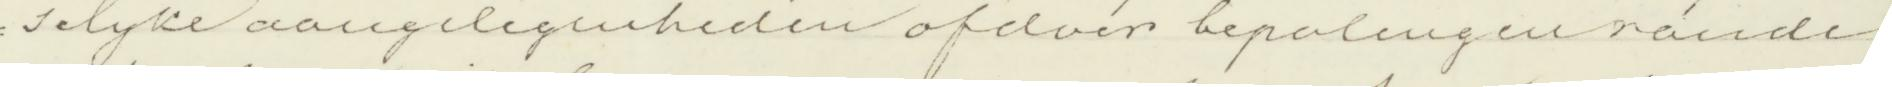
=selyke aangelegenheden ofdoor bepalingen vande
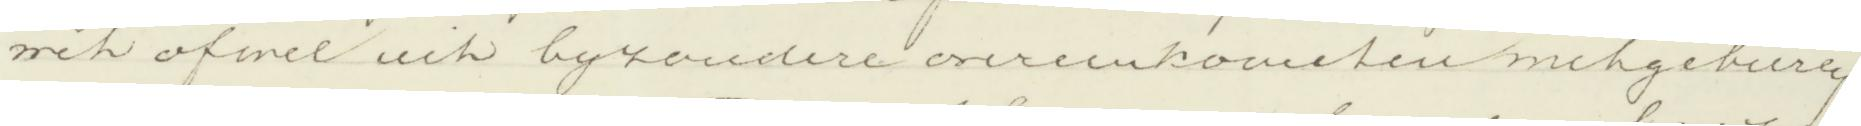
wet ofwel uit byzondere overeenkomsten metgeburen
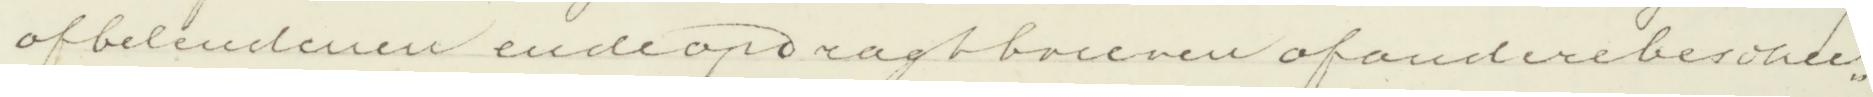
ofbelendenen endeopdragtbrieven ofanderebeschei,
